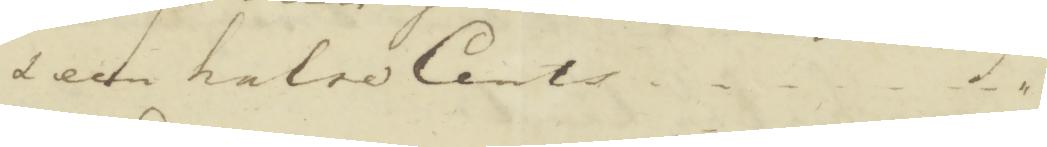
& een halve Cents - - - - - - „
